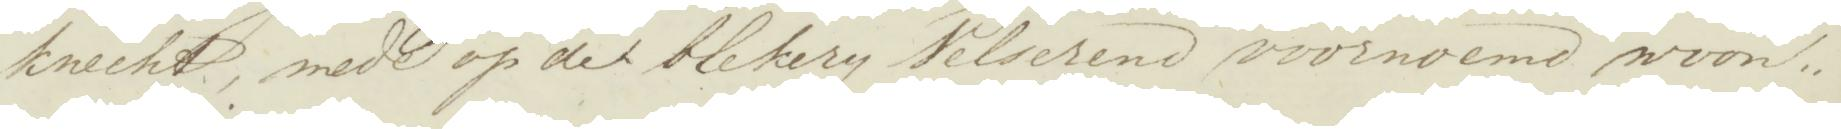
knecht, mede op de blekery Velserend voornoemd woon„
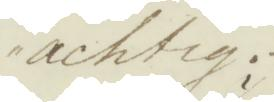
„achtig;
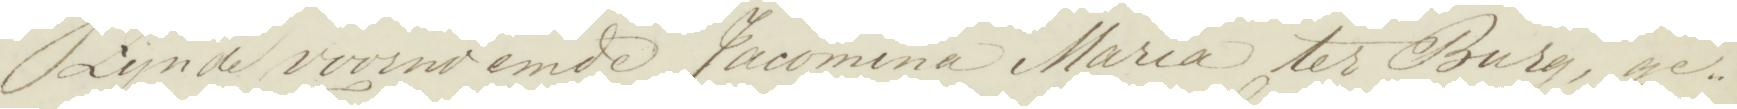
Zynde voornoemde Jacomina Maria ter Burg, ge„
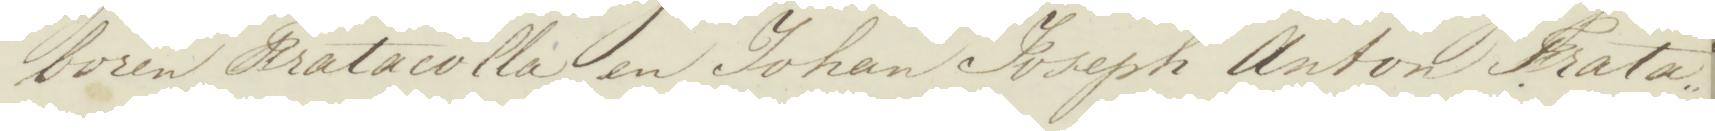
boren Fratacolla en Iohan Ioseph Anton Frata„
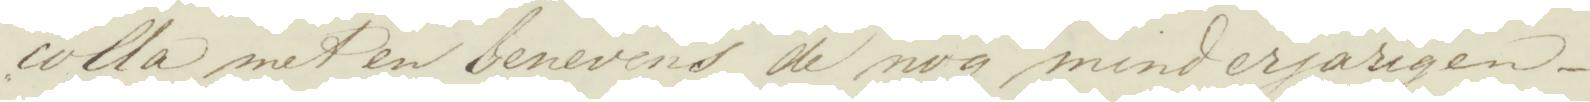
colla met en benevens de nog minderjarigen
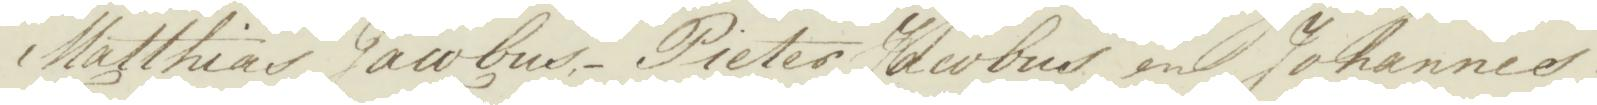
Matthias Jacobus,- Pieter Jacobus en Johannes
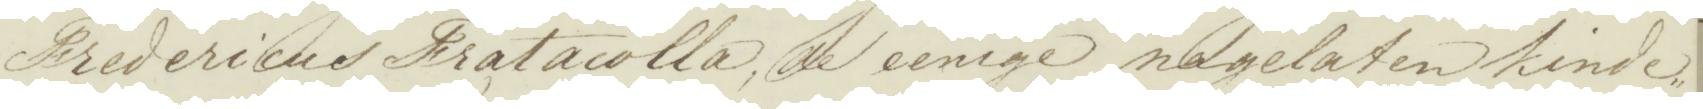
Fredericus Fratacolla, de eenige nagelaten kinde„
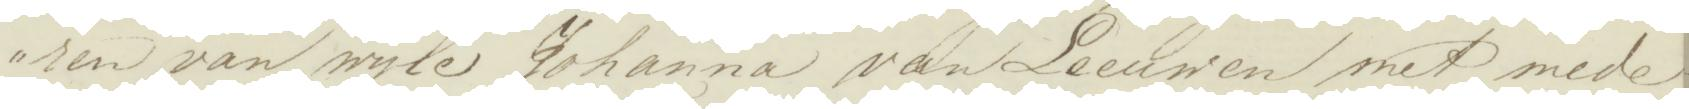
„ren van wyle Johanna van Leeuwen met mede
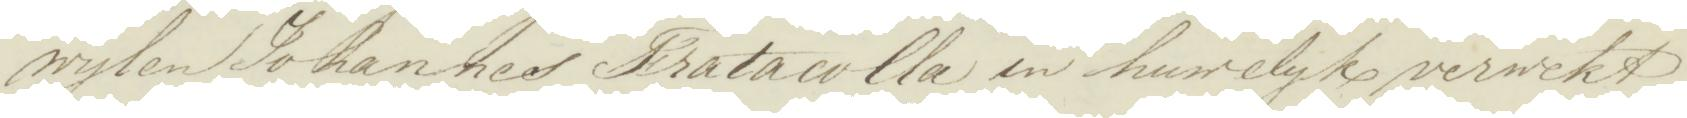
wylen Iohannes Fratacolla in huwelyk verwekt,
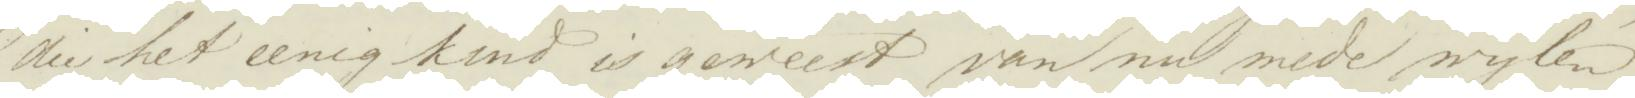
die het eenig kind is geweest van nu mede wylen
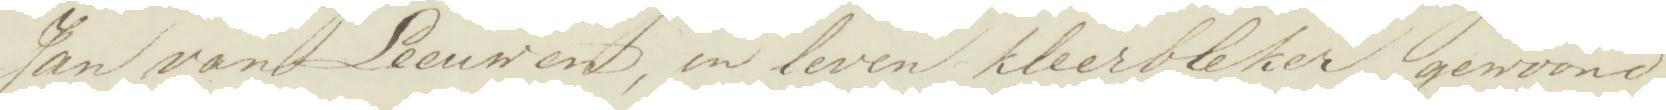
Jan van Leeuwen, in leven kleerbleker gewoond
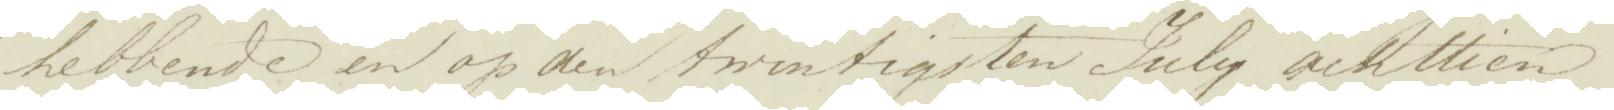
hebbende en op den twintigsten Iuly achttien
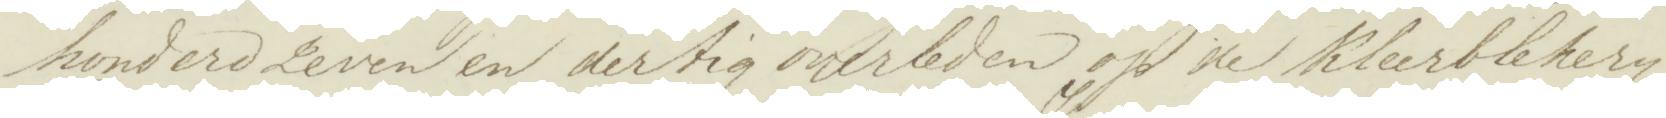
honderd zeven en dertig overleden op de kleerblekery
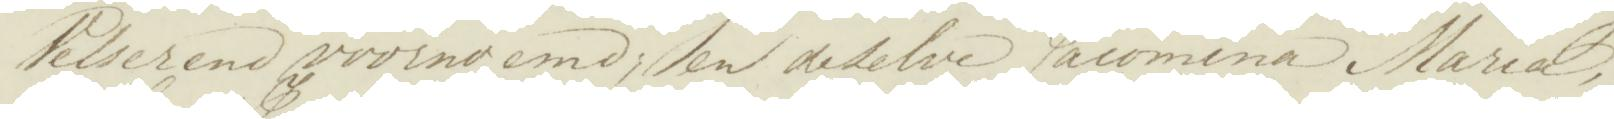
Velserend voornoemd, en dezelve Jacomina Maria,
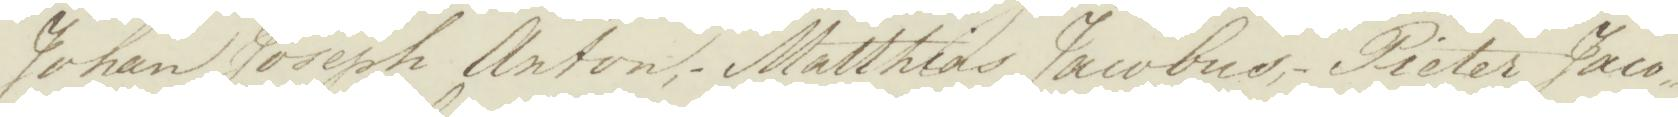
Johan Joseph Anton, Matthias Jacobus, Pieter Jaco
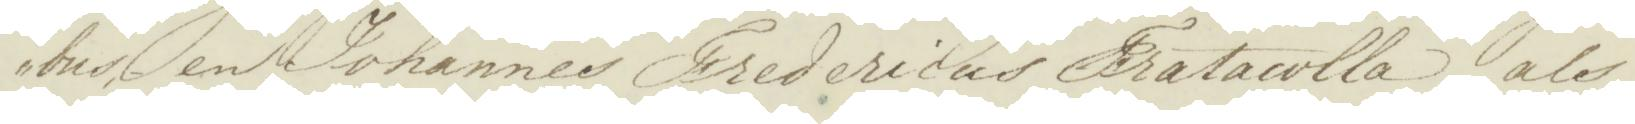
„bus en Iohannes Fredericus Fratacolla, als
